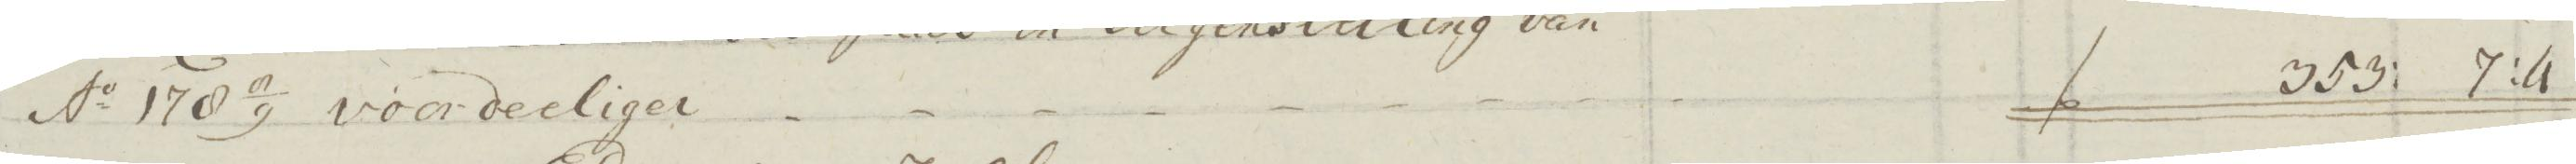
A=o 178 8/9 voordeeliger - - - - - - - - - - ƒ 353: 7:4
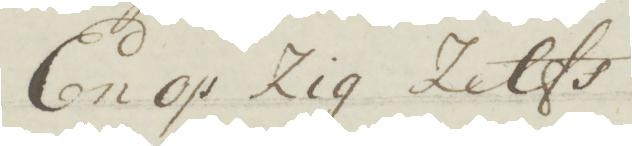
En op zig zelfs
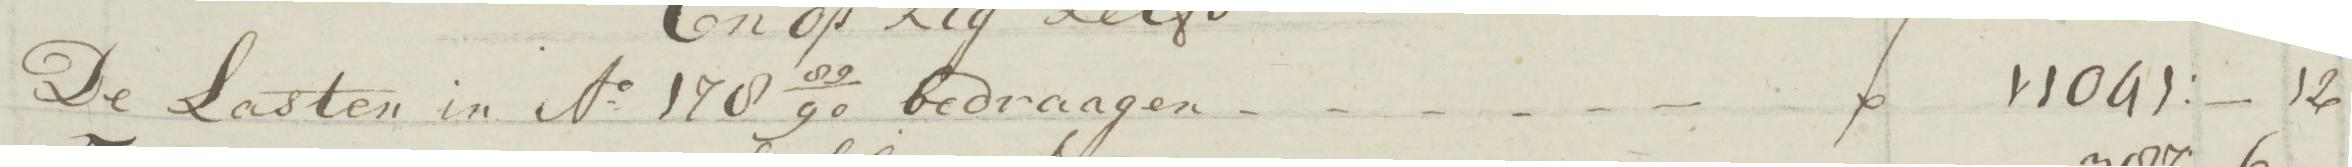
De Lasten in A=o 178 89/90 bedraagen - - - - - - ƒ 11041:— 12
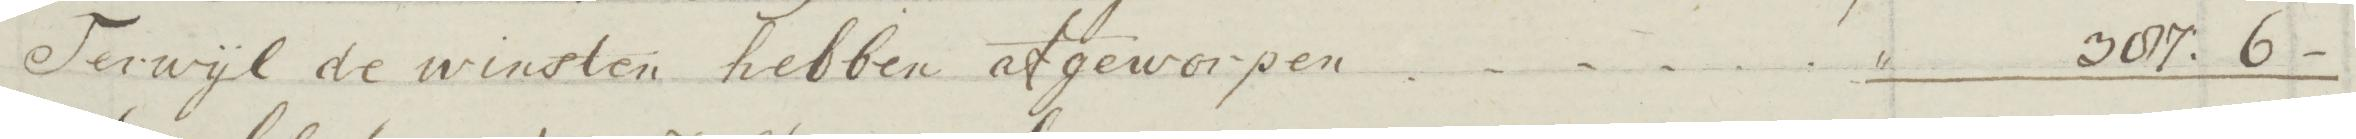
Terwijl de winsten hebben afgeworpen - - - - - - „ 387: 6 -
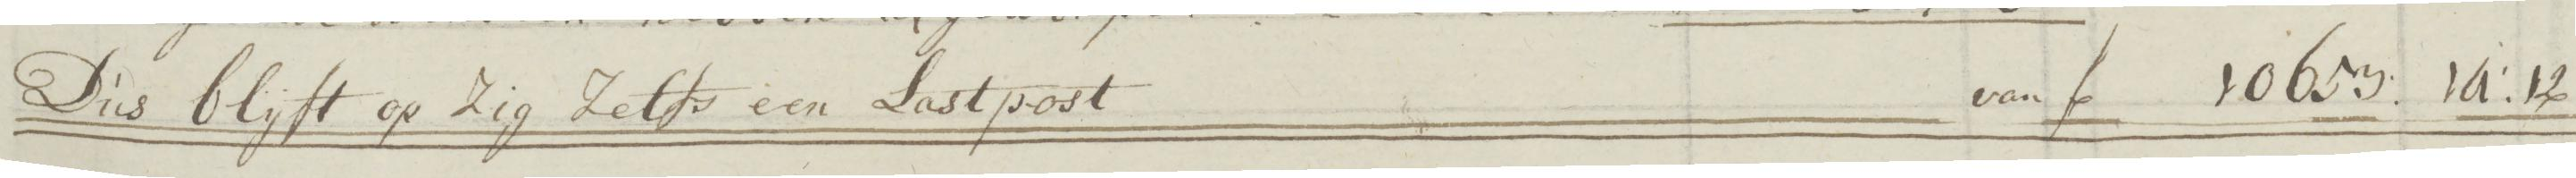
Dus blijft op zig zelfs een Lastpost van ƒ 10653: 14:12
